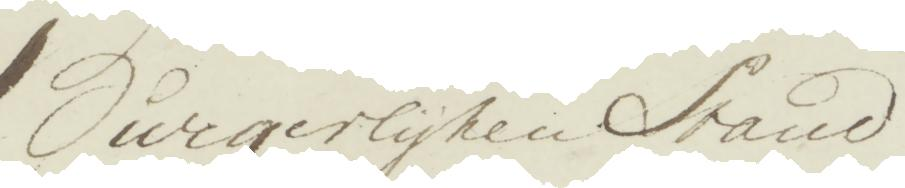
Burgerlijken Stand
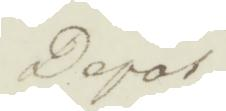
Depot
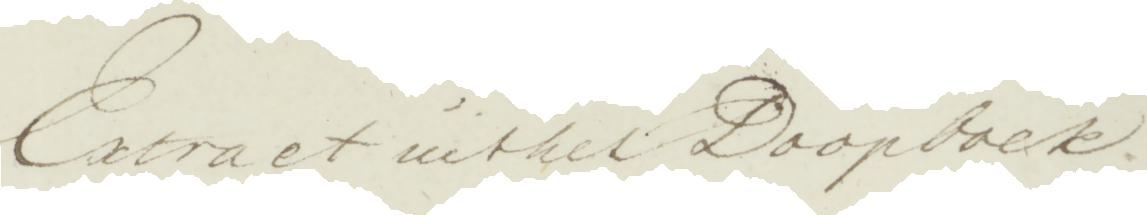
Extract uit het Doopboek
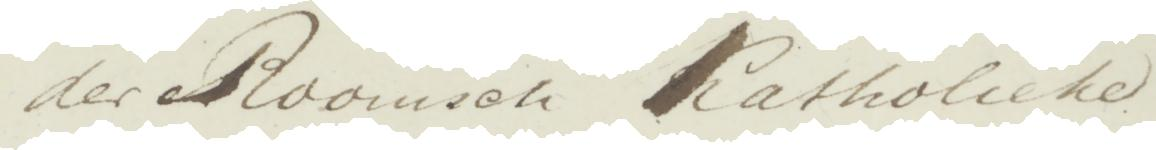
der Roomsch Katholieke
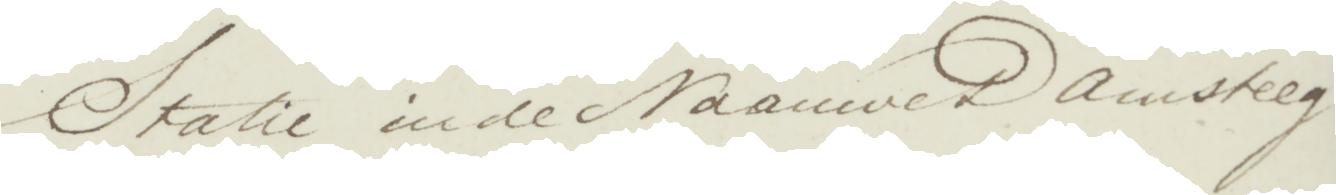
Statie in de Naauwe Damsteeg
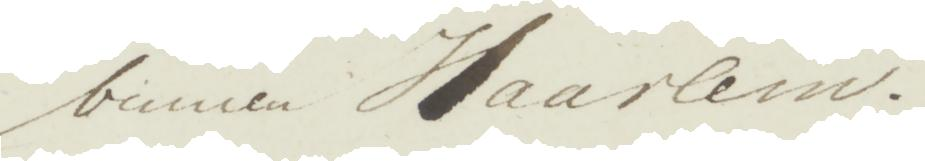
binnen Haarlem.
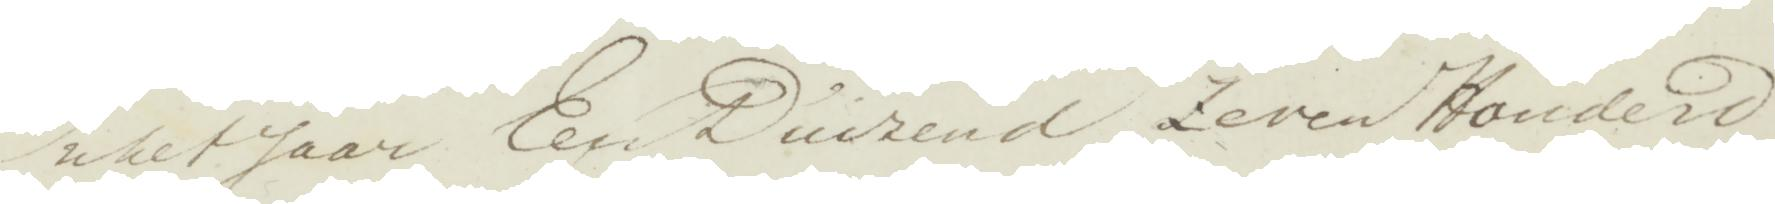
In het Jaar Een Duizend Zeven Honderd
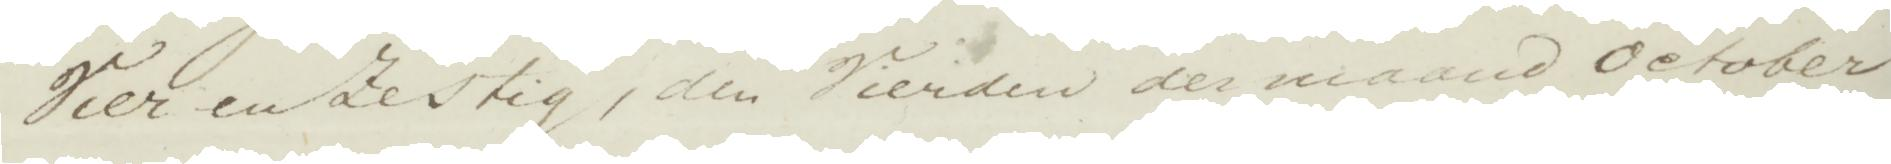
Vier en Zestig, den Vierden der maand October
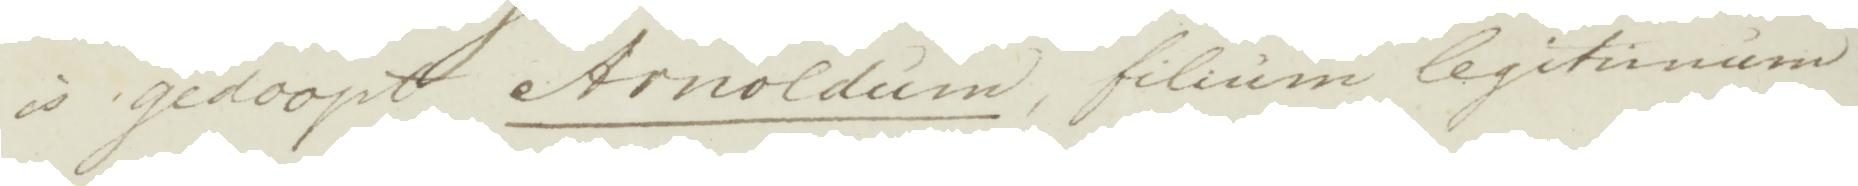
is gedoopt Arnoldum, filium legitimum
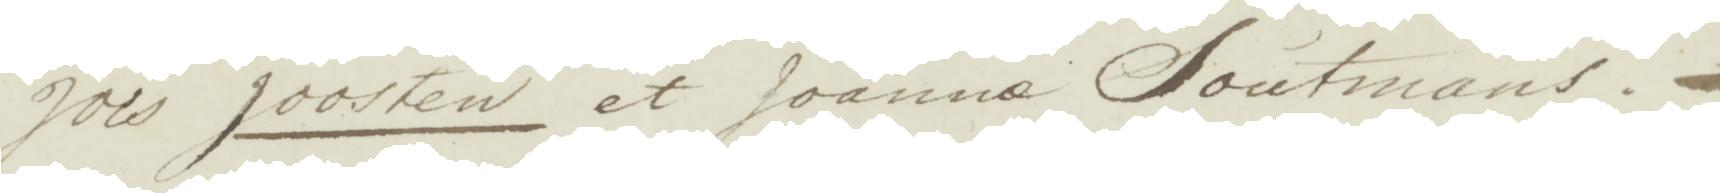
Joes Joosten et Joanne Soutmans.
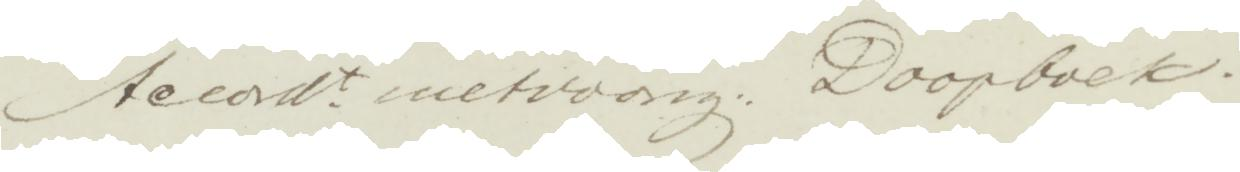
Accord.t met voorsz: Doopboek.
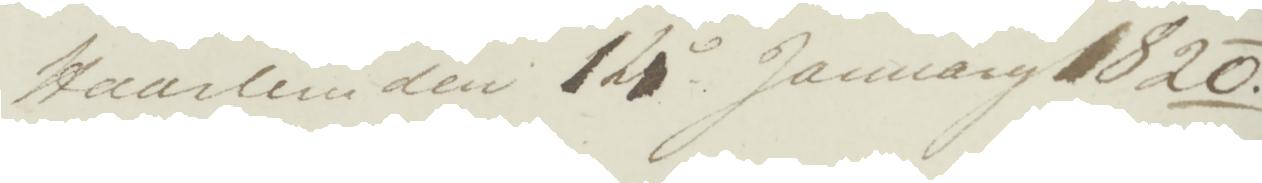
Haarlem den 14.e January 1820.
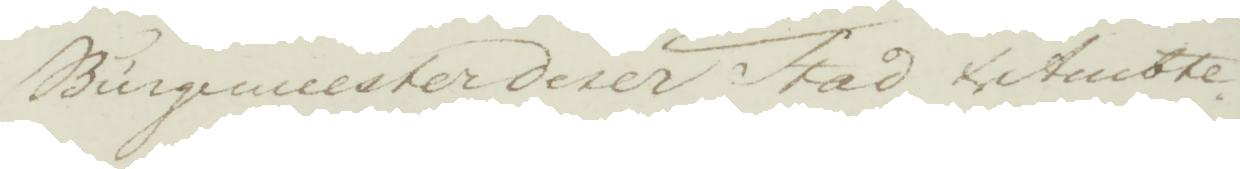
Burgemeester deser Stad te Amste„
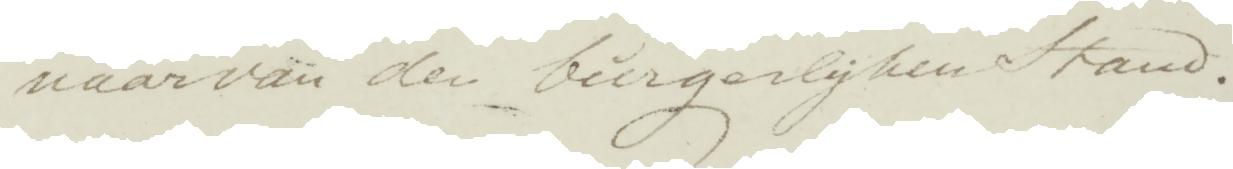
waarvan de burgerlijken stand.
